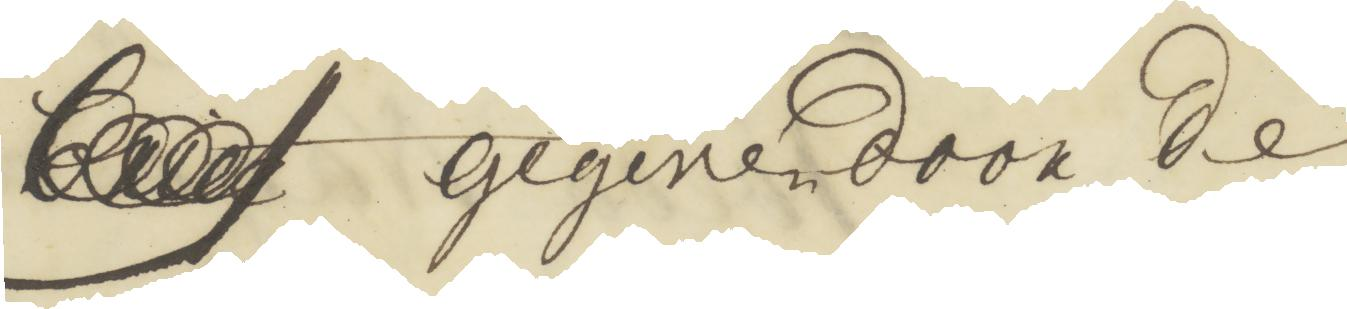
brief gegeven door de
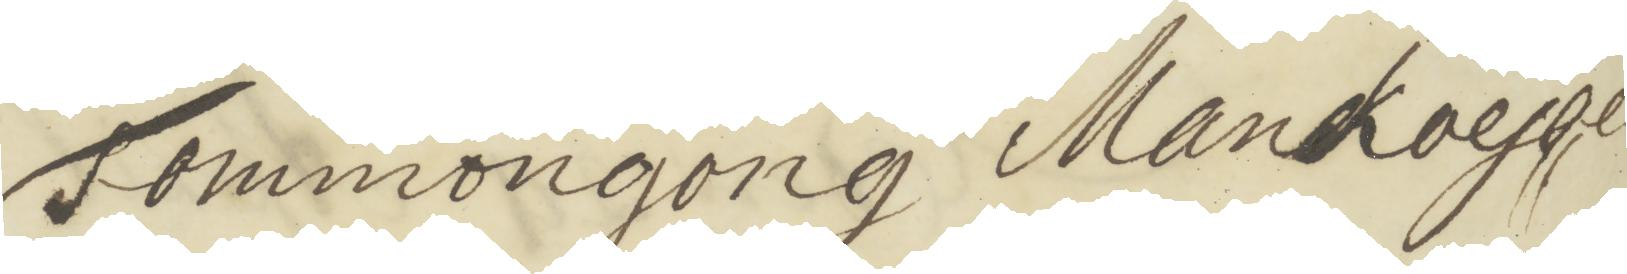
Tommongong Mankoejoe
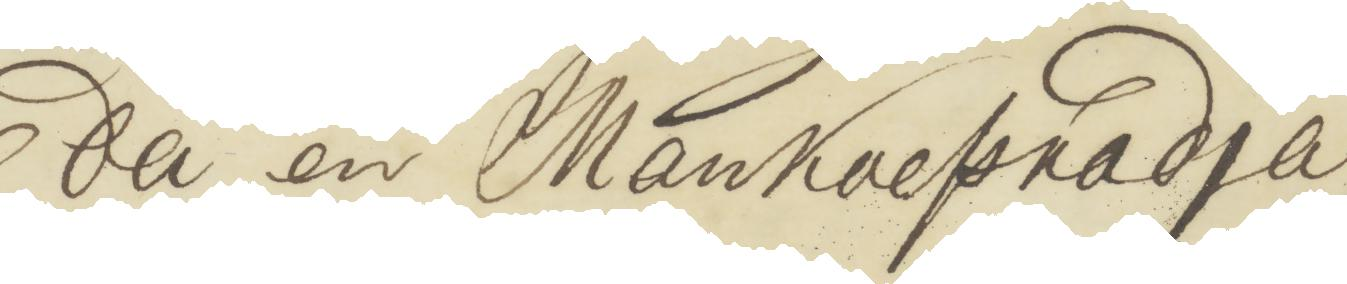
da en Mankoepradja
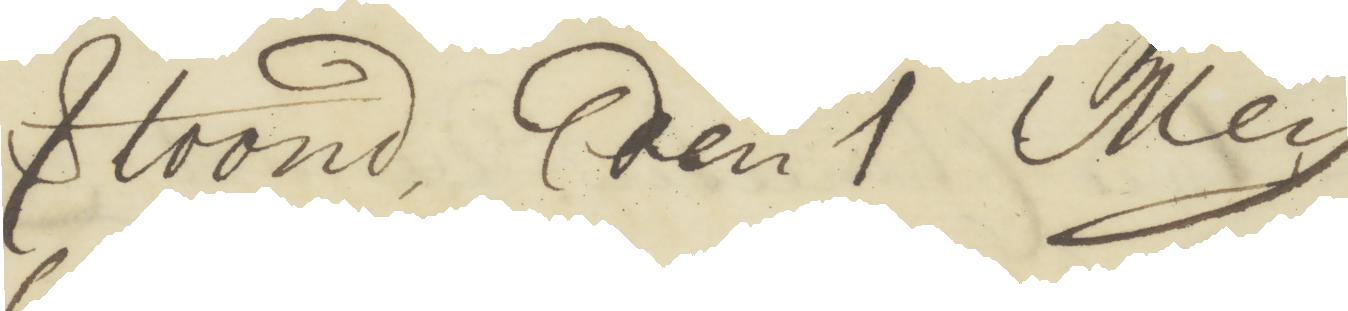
vertoond, den 1 Meij
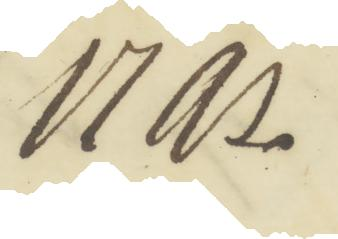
Ao 1741.
